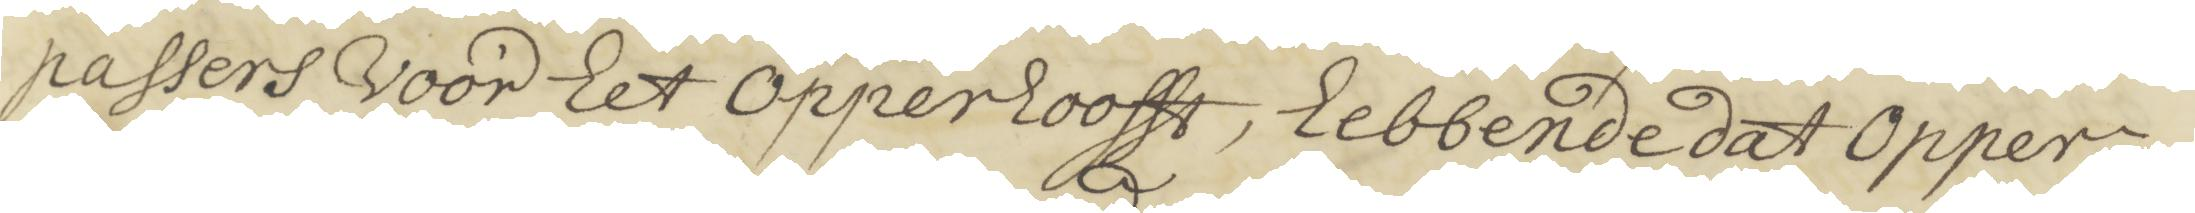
passers voor het opperhoofft, hebbende dat opper=
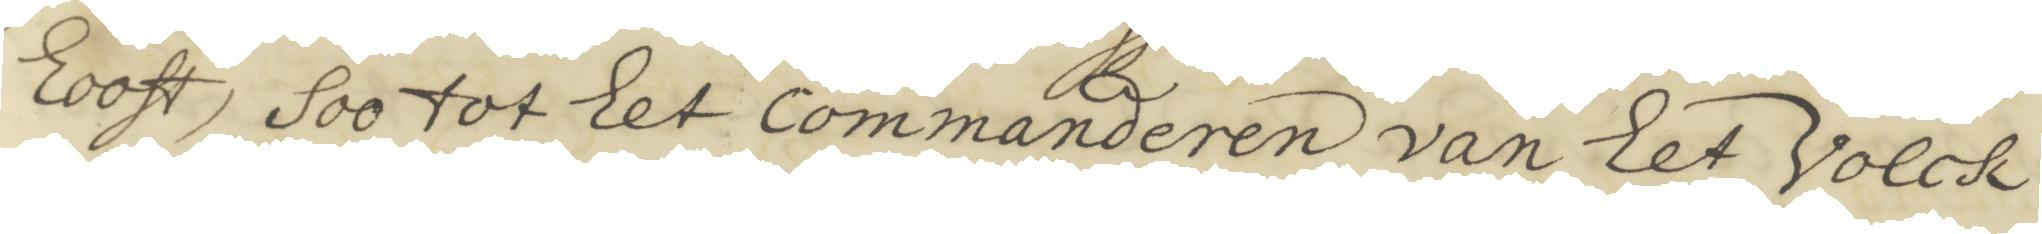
hooft, soo tot het commanderen van het Volck
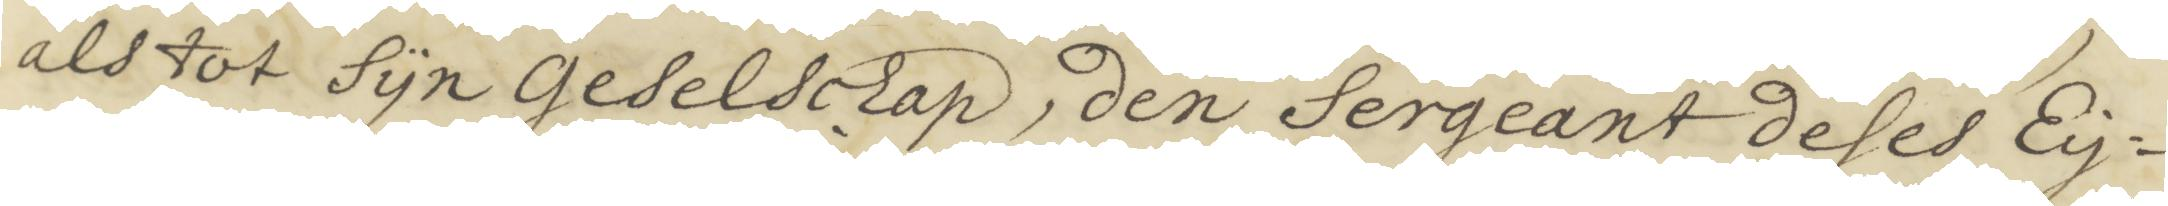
als tot sijn geselschap, den sergeant deses Eij=
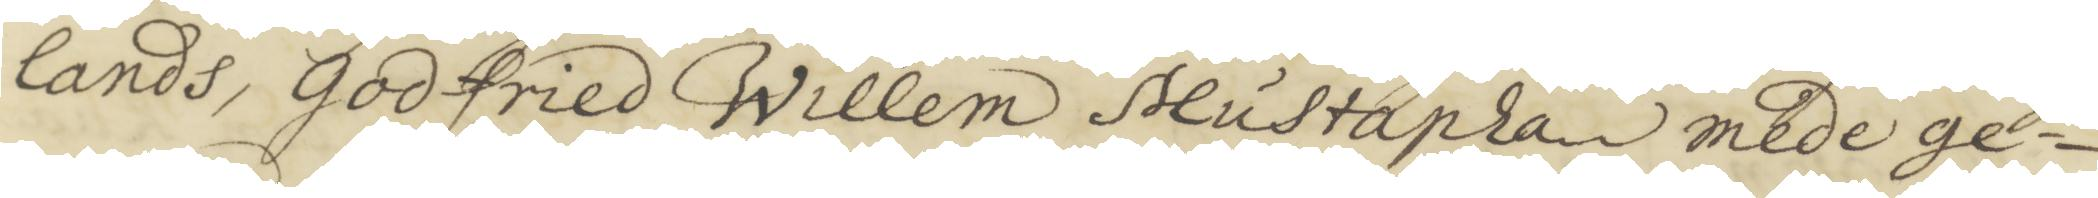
lands, Godfried Willem Mustapha mede ge=
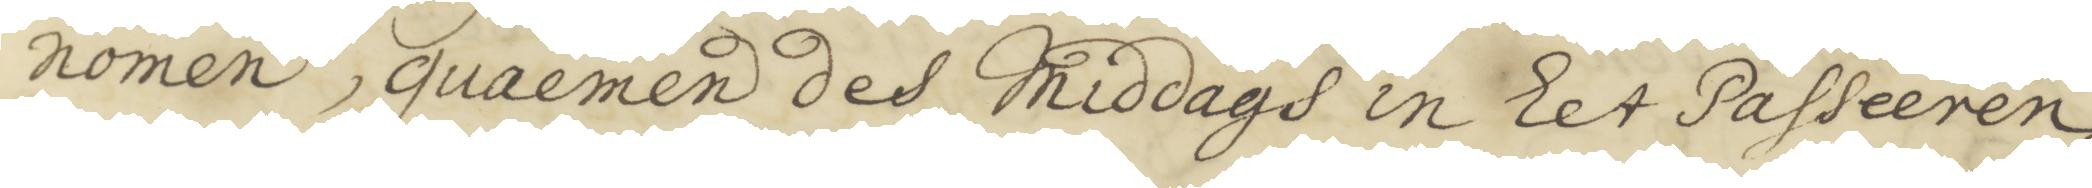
nomen, quaemen des middags in het Passeeren
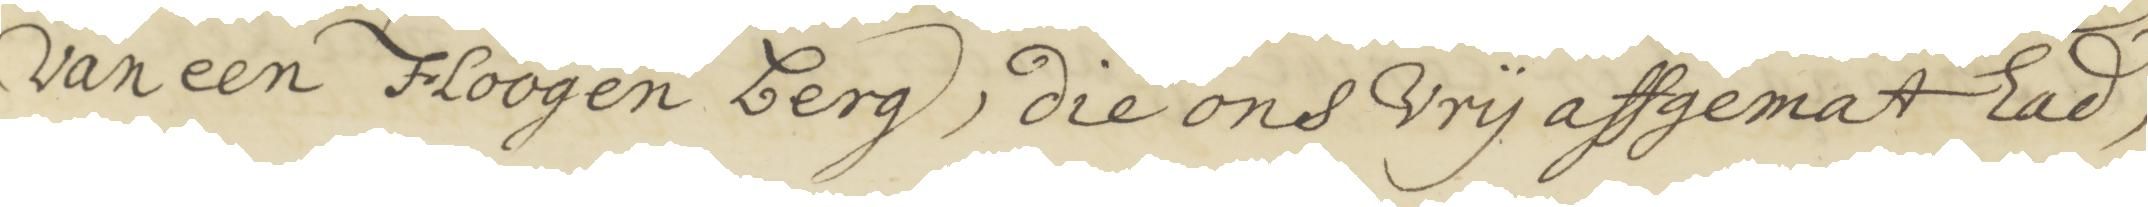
van een Hoogen berg, die ons vrij afgemat had,
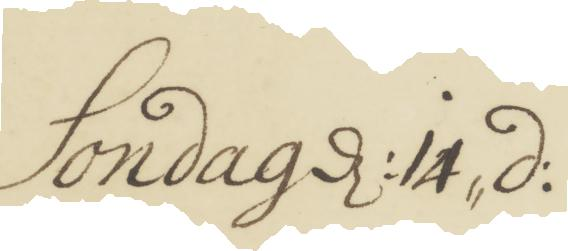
sondagh:14„ d:
